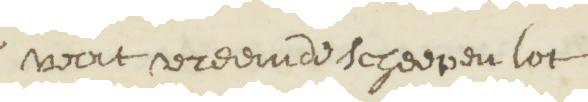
wat vreemde scheepen tot
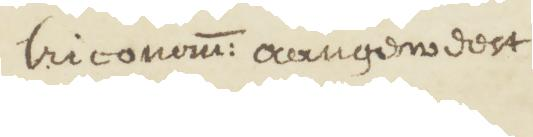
triconem: aangeweest
